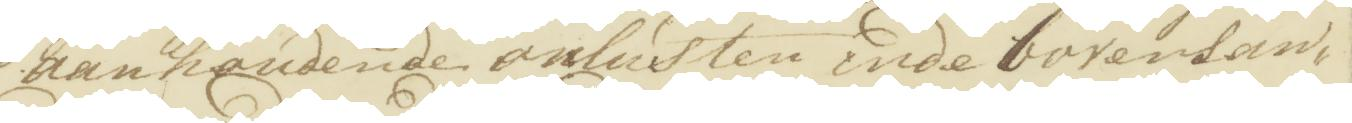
aanhoudende onlusten inde bovenlan„
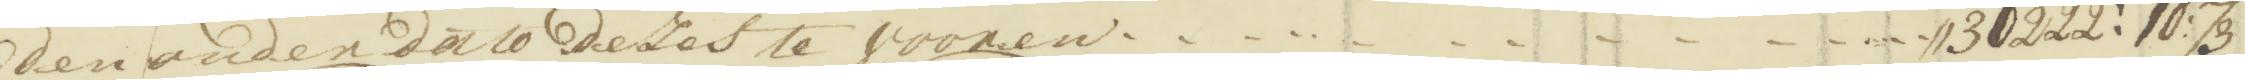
den onder dato dezes te vooren- - - - . . - - - - - - - . .-.„36222: 10: 2/3
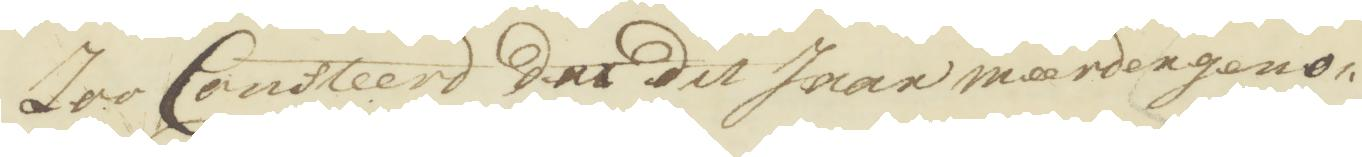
zoo consteerd dat dit Jaar meerder geno„
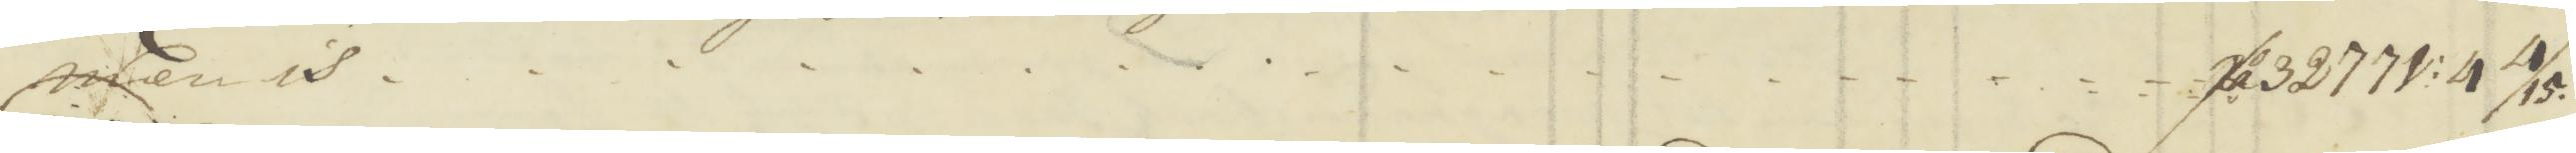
men is . . . . - . . . . . - - - - - . - - = = =r o/a 32771:4 4/15.
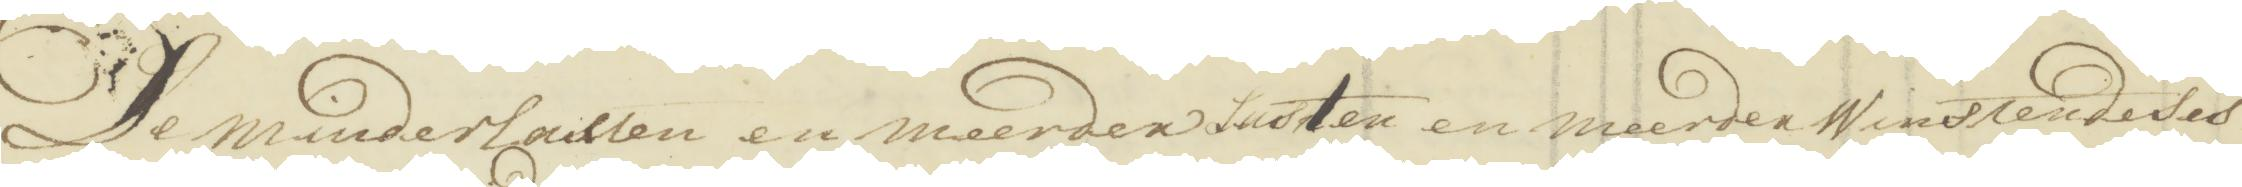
De minder lasten en meerder lusten en meerder Winsten deses
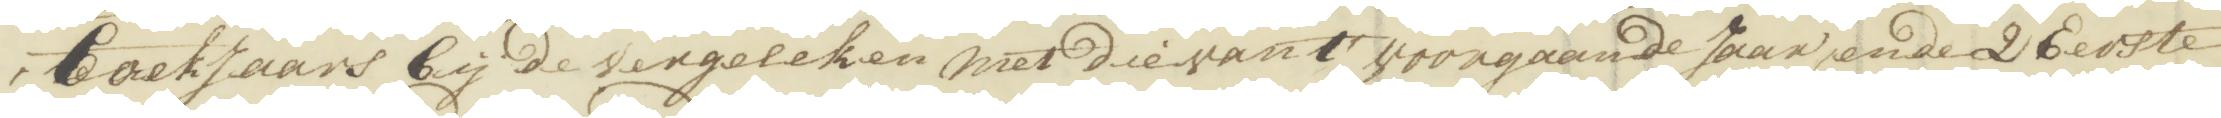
boekjaars bij de vergeleken met die van ’t voorgaande Jaar, ende 2 Eerste
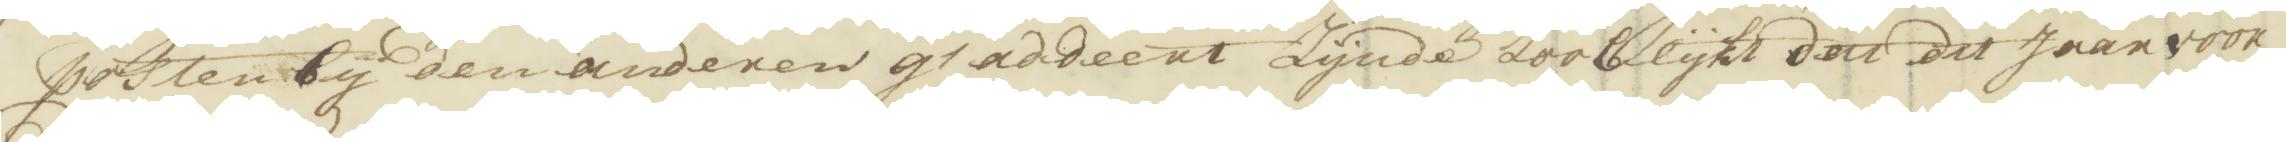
posten bij den anderen g'addeert zijnde zoo blijkt dat dit jaar voor
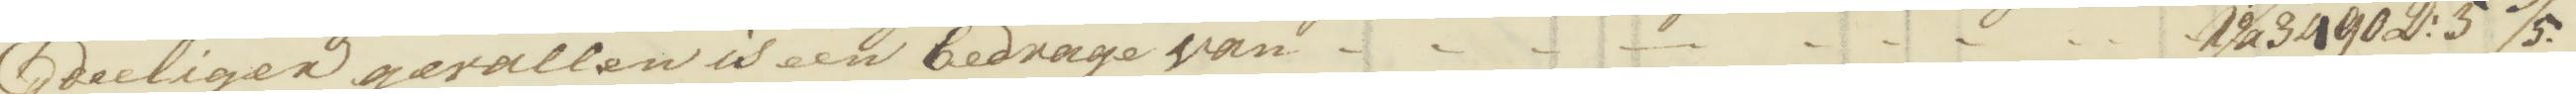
deeliger gevallen is een bedrage van - - - - - . . . . . r o/a 34902:5 3/5.
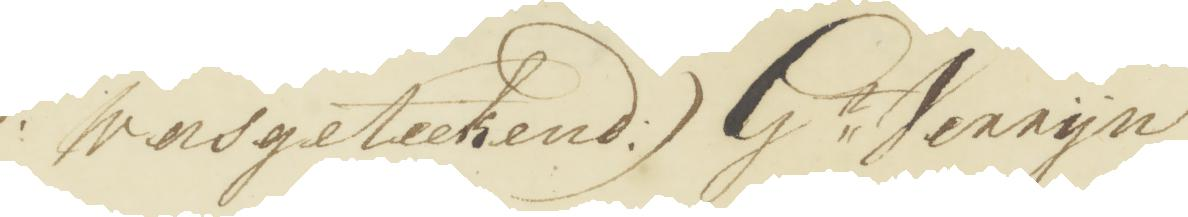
:wasgeteekend:) G„t Verrijn
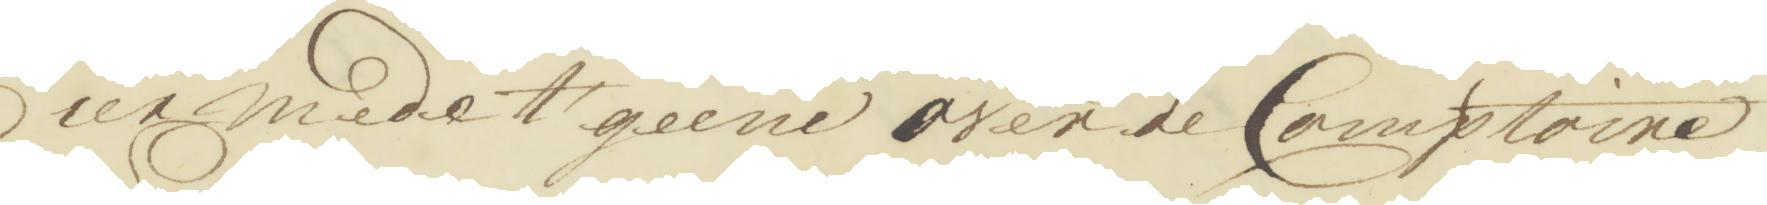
Hier mede t' geene over de Comptoire
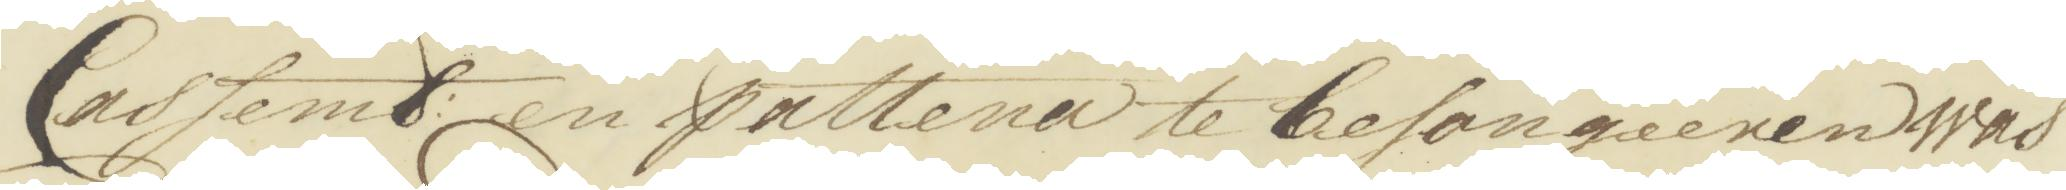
Cassemb: en pattena te besongeeren was
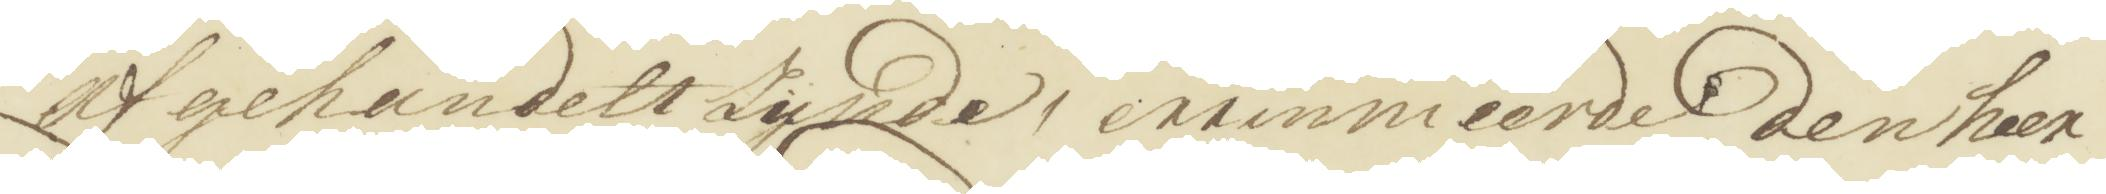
afgehandelt zijnde, errinmeerde den heer
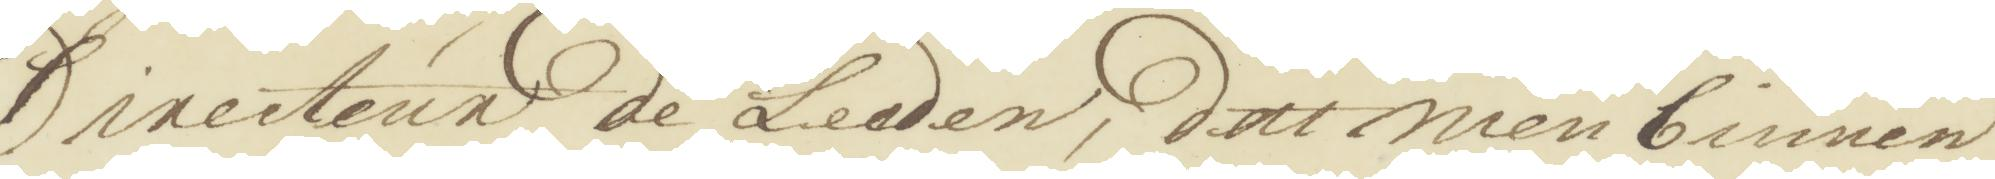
Directeur de leeden, dat men binnen
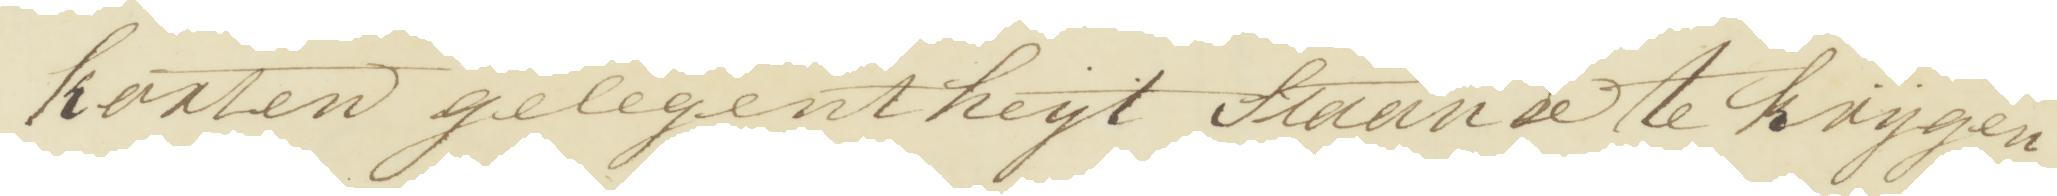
korten gelegentheijt staande te krijgen
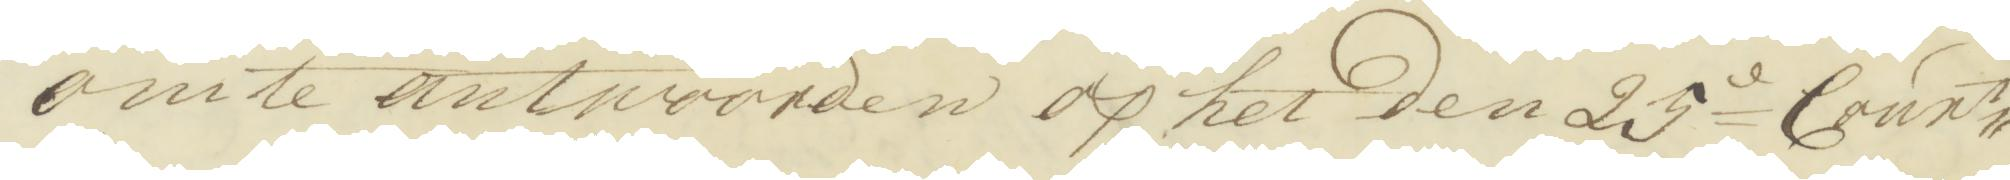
om te antwoorden op het den 25=e Cour„t
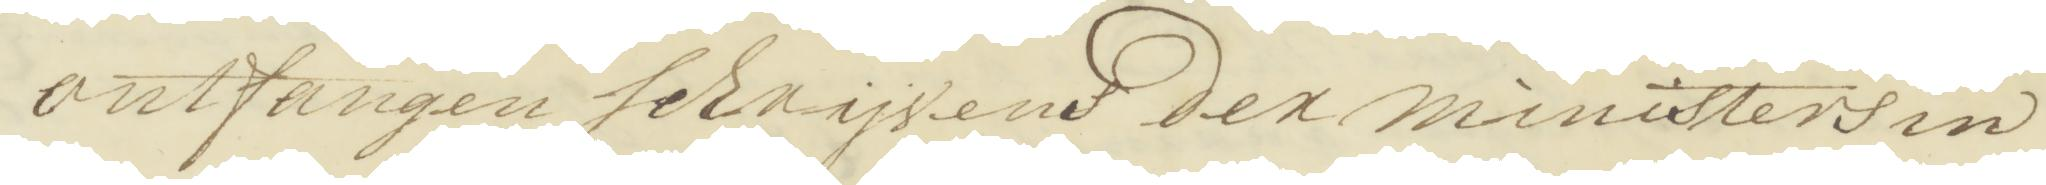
ontfangen schrijvens der ministers in
